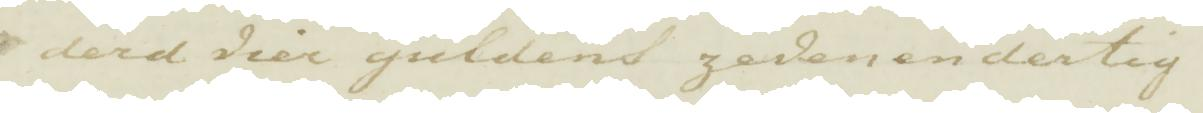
derd vier guldens zevenendertig
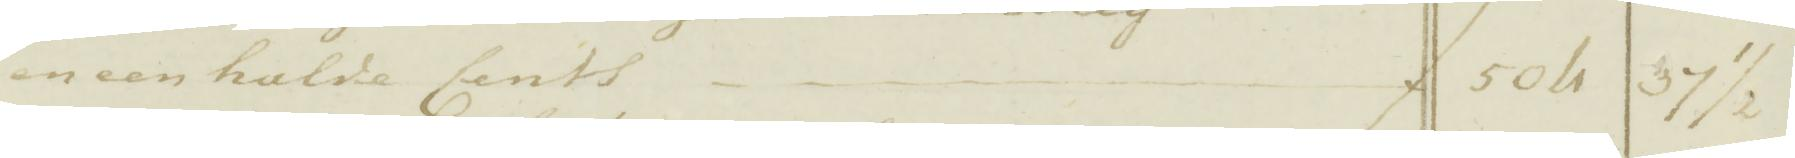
en een halve Cents f 504 37½
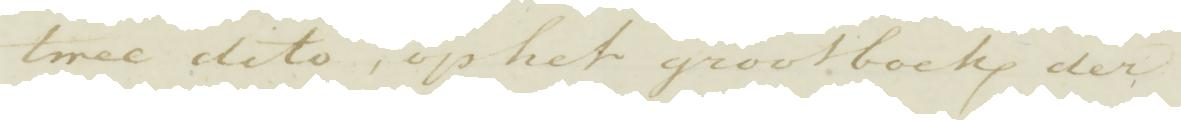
twee dito, op het grootboek der
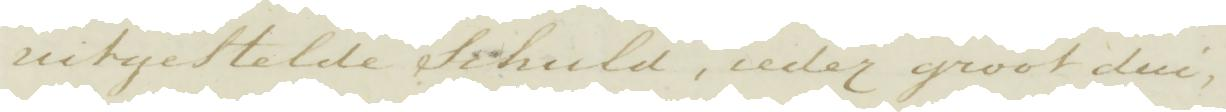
uitgestelde schuld, ieder groot dui„
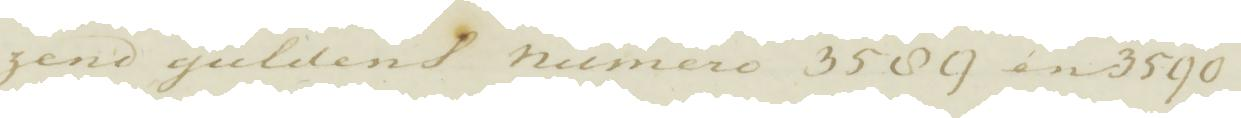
zend guldens numero 3589 en 3590
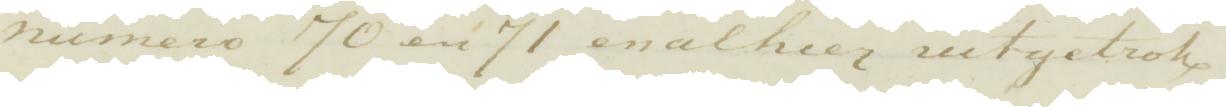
numero 70 en 71 en alhier uitgetrok
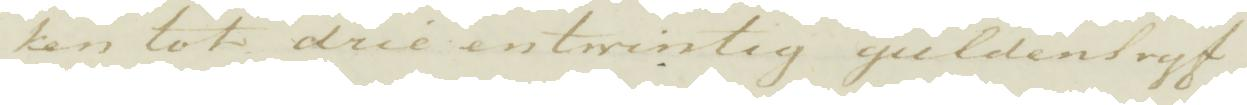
ken tot drie entwintig guldens vyf
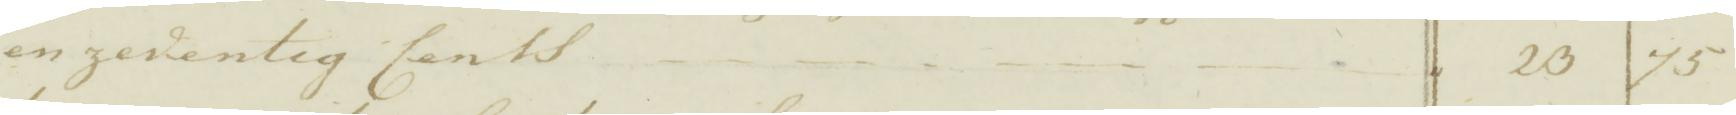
en zeventig Cents 23 75
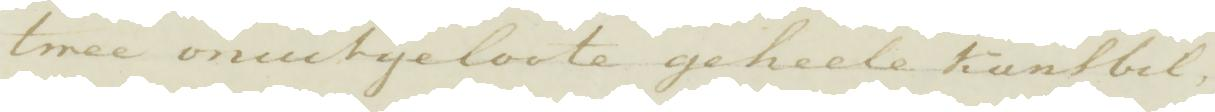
twee onuitgeloote geheele kansbil,
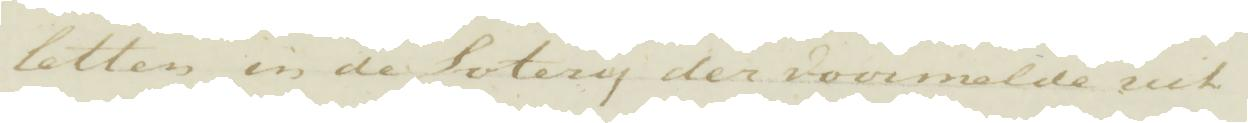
letten in de Lotery der voormelde uit
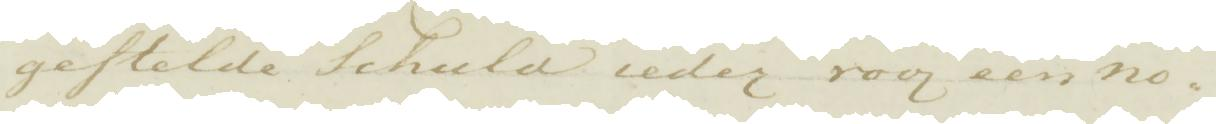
gestelde schuld ieder voor een no„
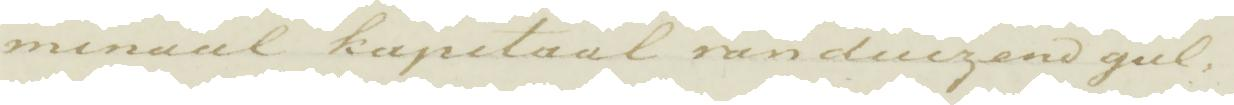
minaal kapitaal van duizend gul,
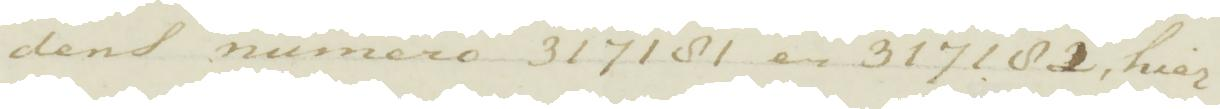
dens numero 317181 en 317182, hier
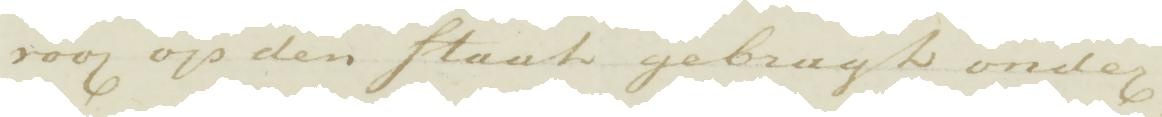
voor op den staat gebragt onder
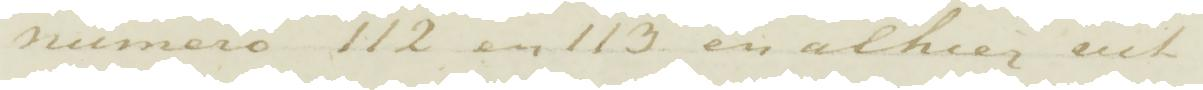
numero 112 en 113. en alhier uit
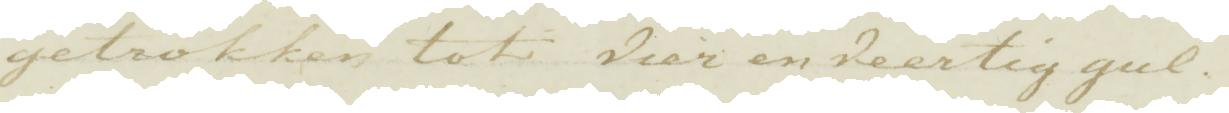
getrokken tot vier en veertig gul,
